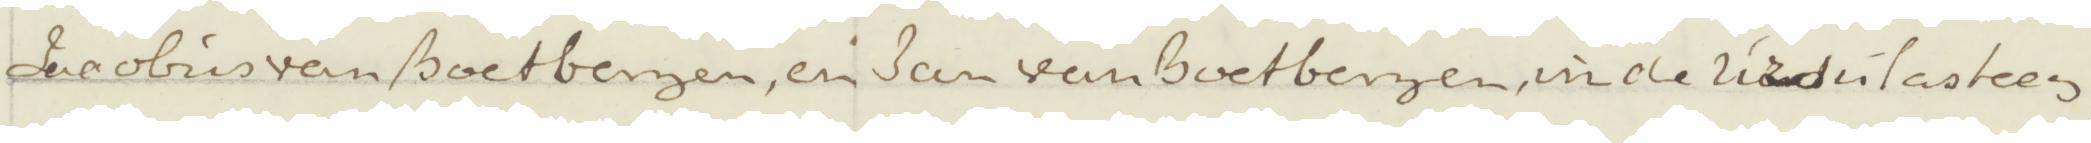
Jacobus van Boetbergen, en Jan van Boetbergen, in de ursulasteeg
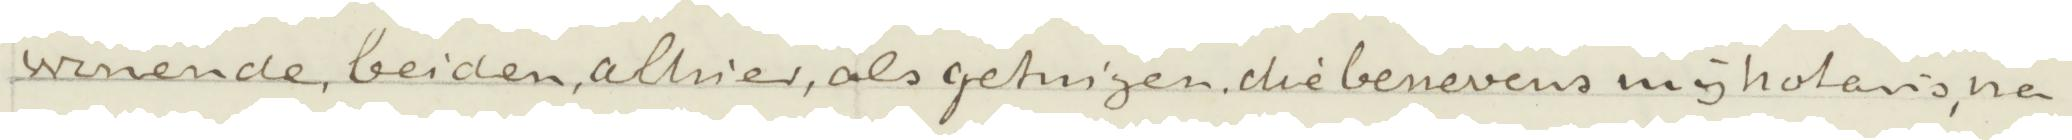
wonende, beiden, alhier, als getuigen, die benevens mij notaris, na
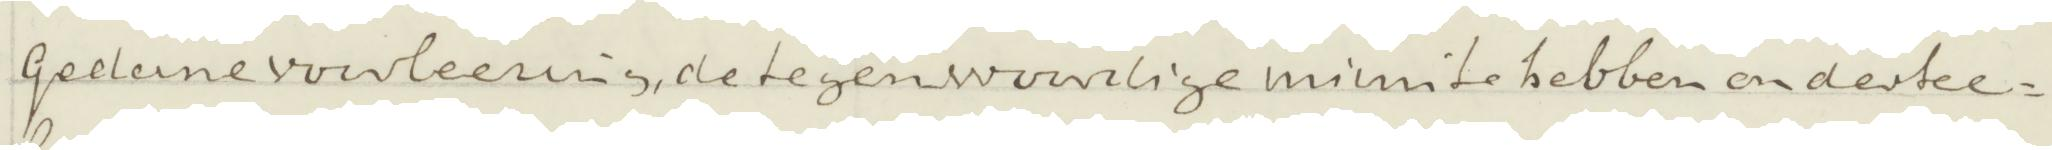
gedane voorleezing, de tegenwoordige minute hebben ondertee=
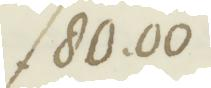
ƒ80.00
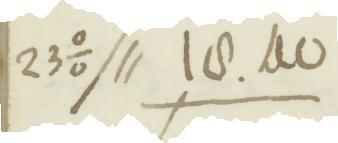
23% „ 18.40
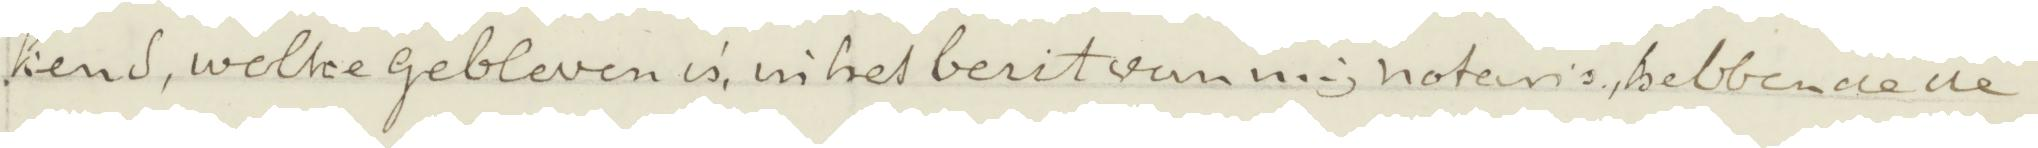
=kend, welke gebleven is, in het bezit van mij notaris, hebbende de
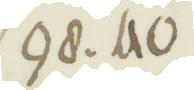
ƒ98.40
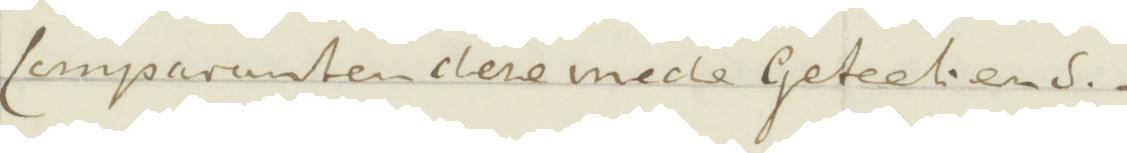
Comparanten deze mede Geteekend.
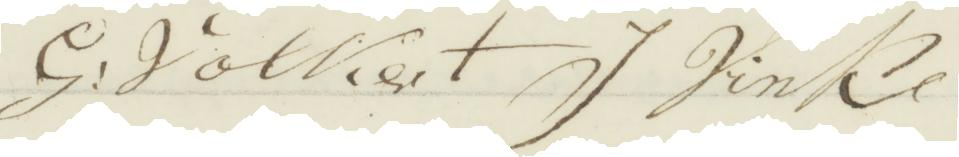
G: Volkert J Vinke
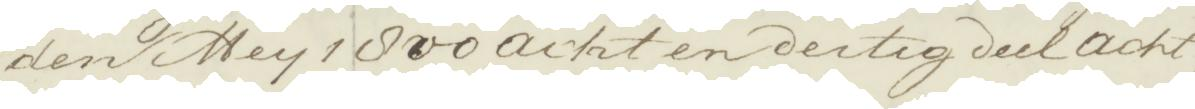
den Mey 1800 acht en dertig deel acht
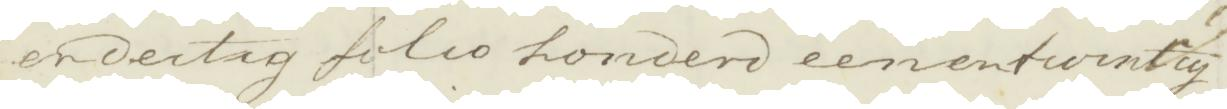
en dertig folio honderd een en twintig
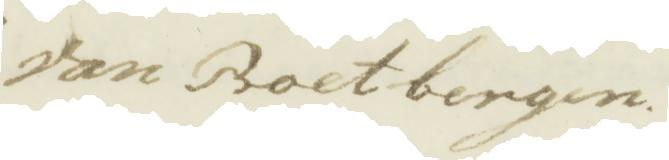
J. van Boetbergen.
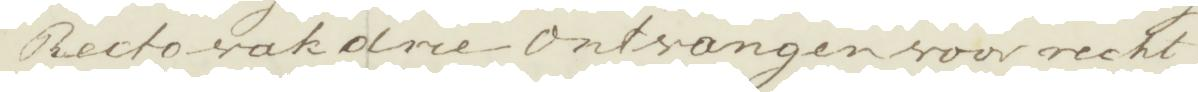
Recto vak drie ontvangen voor recht
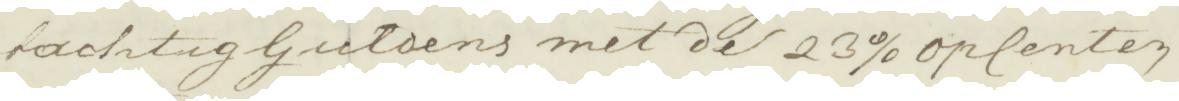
rachtig Guldens met de 23% opcenten
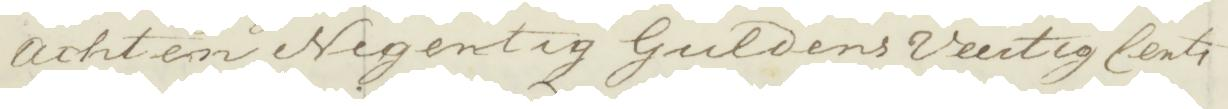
acht en Negentig Guldens Veertig Cents
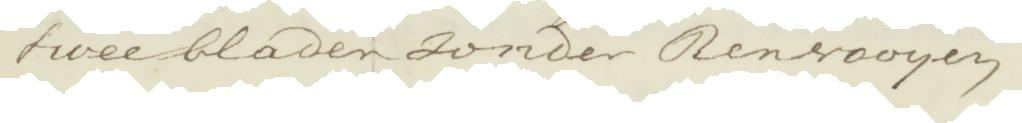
twee bladen zonder Renvooyen
